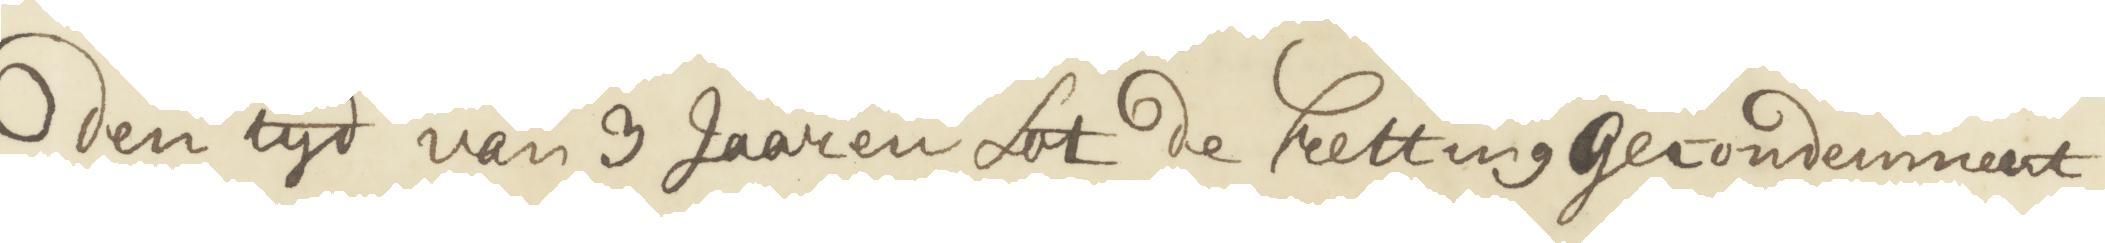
den tijd van 3 jaaren tot de ketting gecondemneert
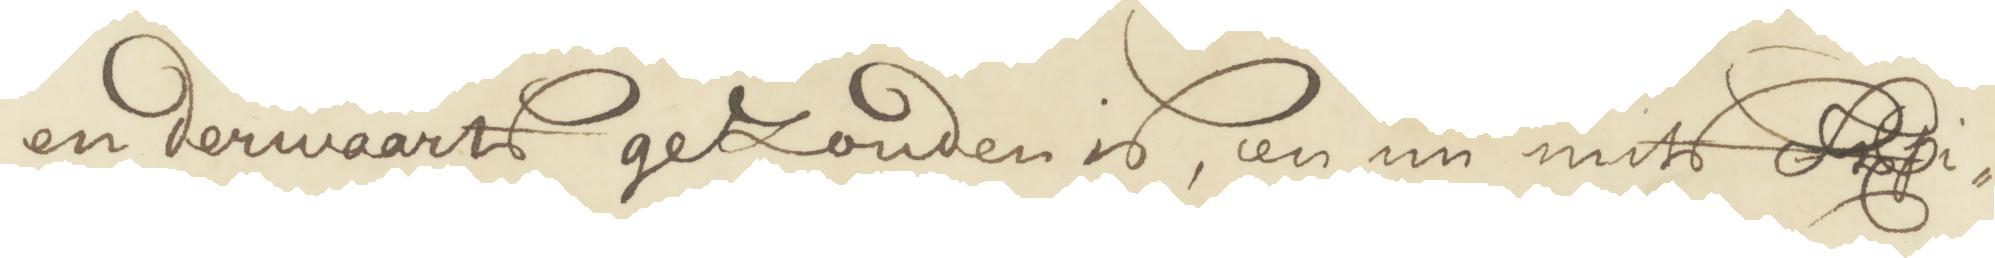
en derwaarts gezonden is, en nu mits Expi„
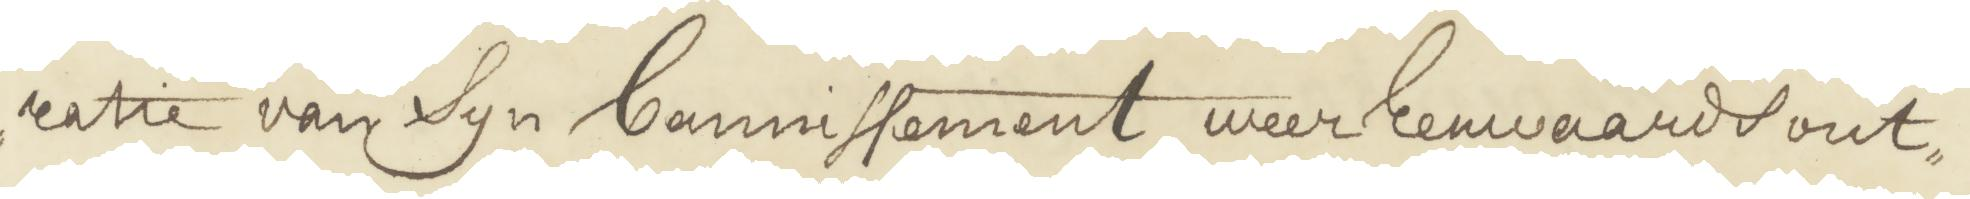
„ratie van syn banissement weer herwaards ont„
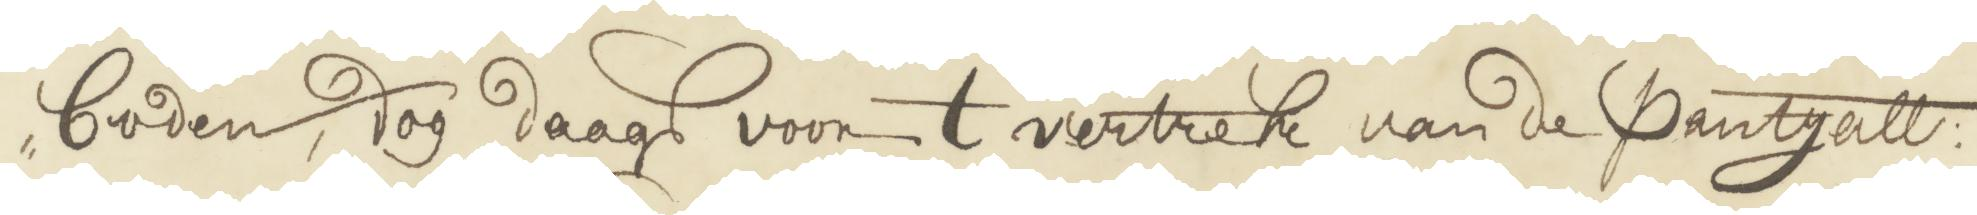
„boden, dog daags voor ’t vertrek van de pantjall:
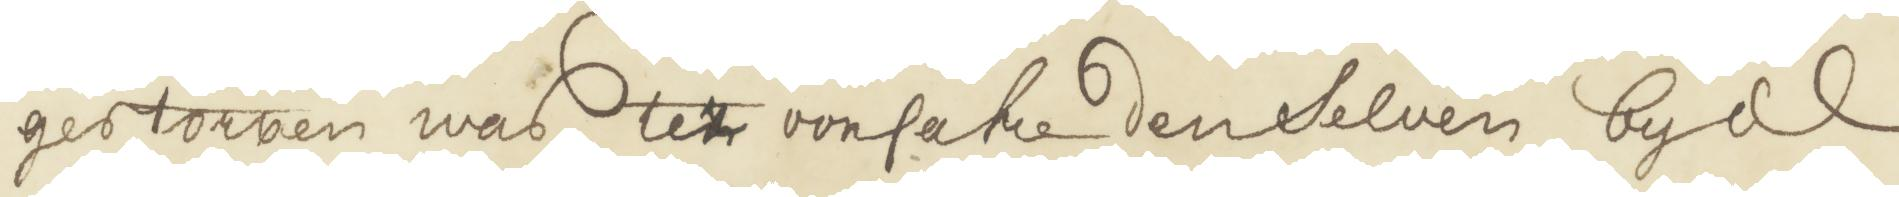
gestorven was ter oorsake denselven by de
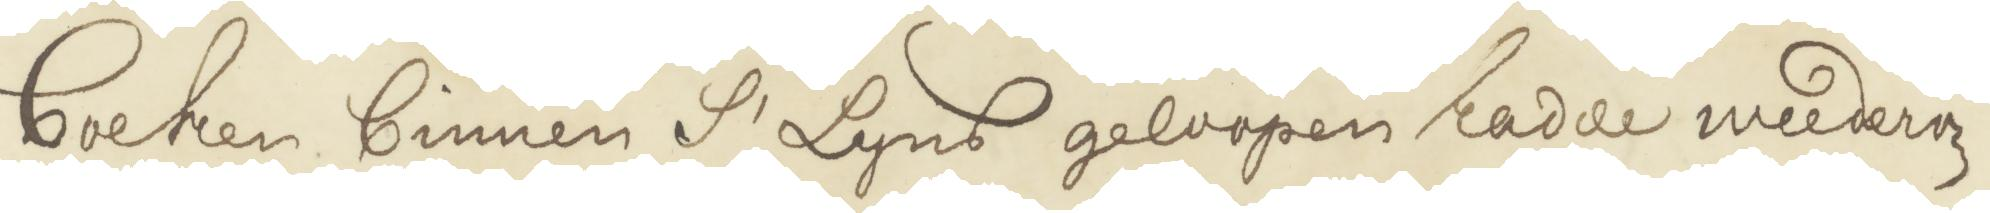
boeken binnen s' lyns geloopen hadde weederom
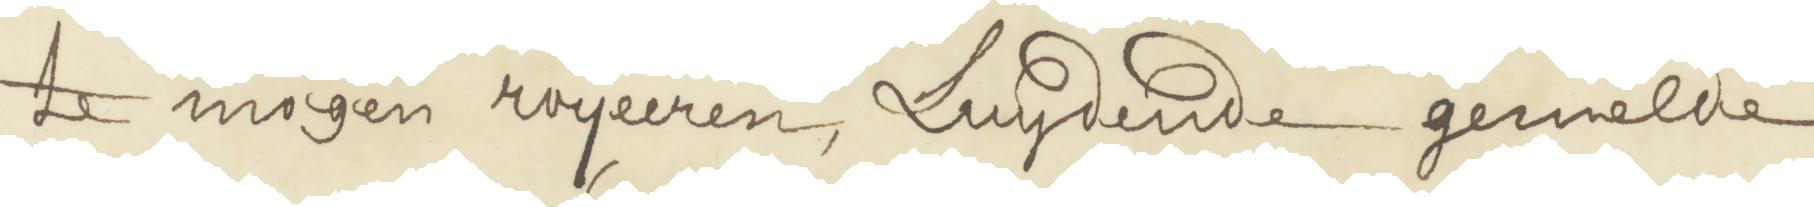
te mogen royeeren, luydende gemelde
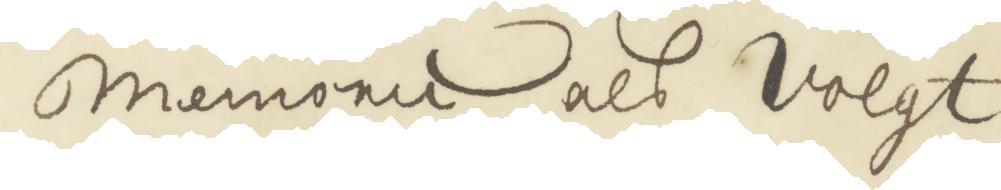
Memorie als volgt.
